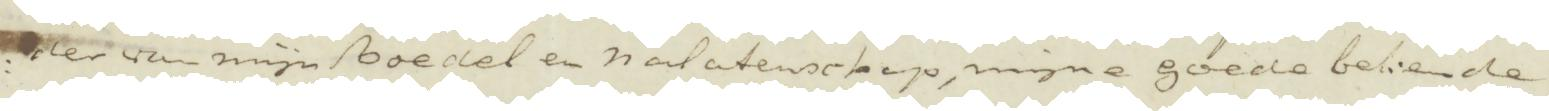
=der van mijn Boedel en nalatenschap, mijne goede bekende
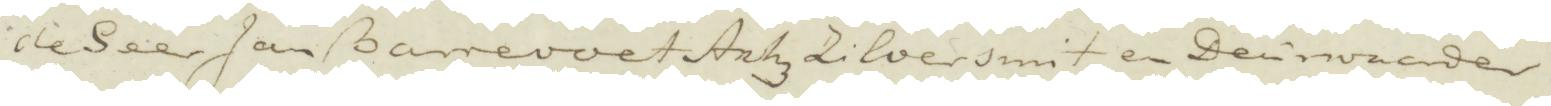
de heer Jan Barrevoet Artz Zilversmit, en Deurwaarder
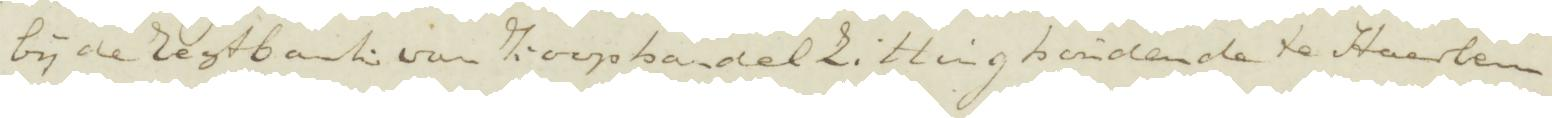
bij de regtbank van koophandel zitting houdende te Haarlem
